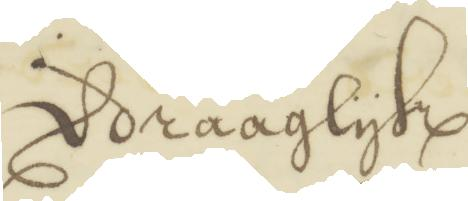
verdraaglijk
